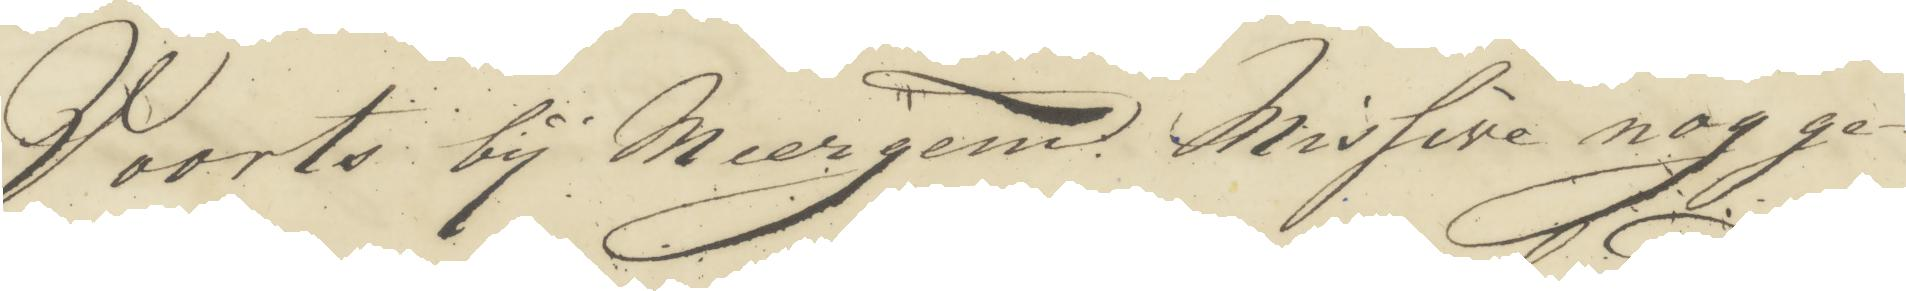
Voorts: bij meergem: missive nog ge=
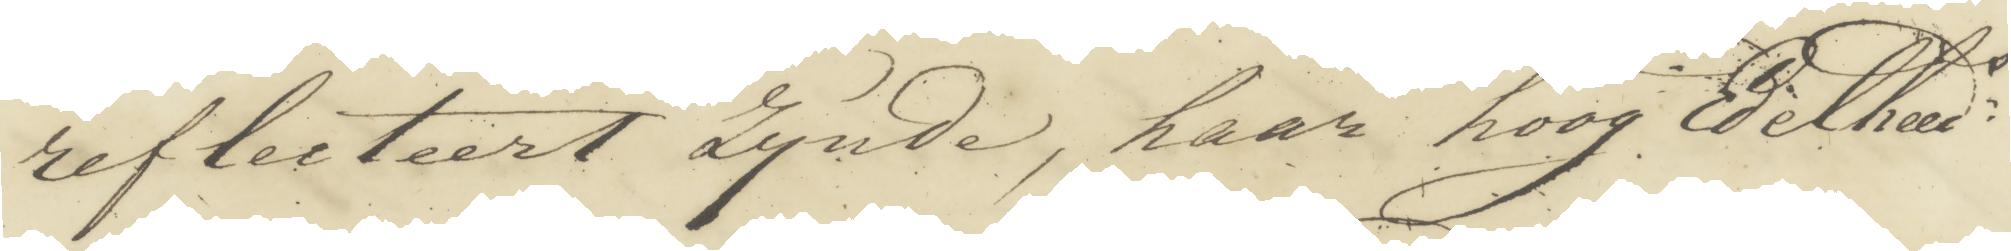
reflecteert Zijnde, haar hoog Edelheed:s
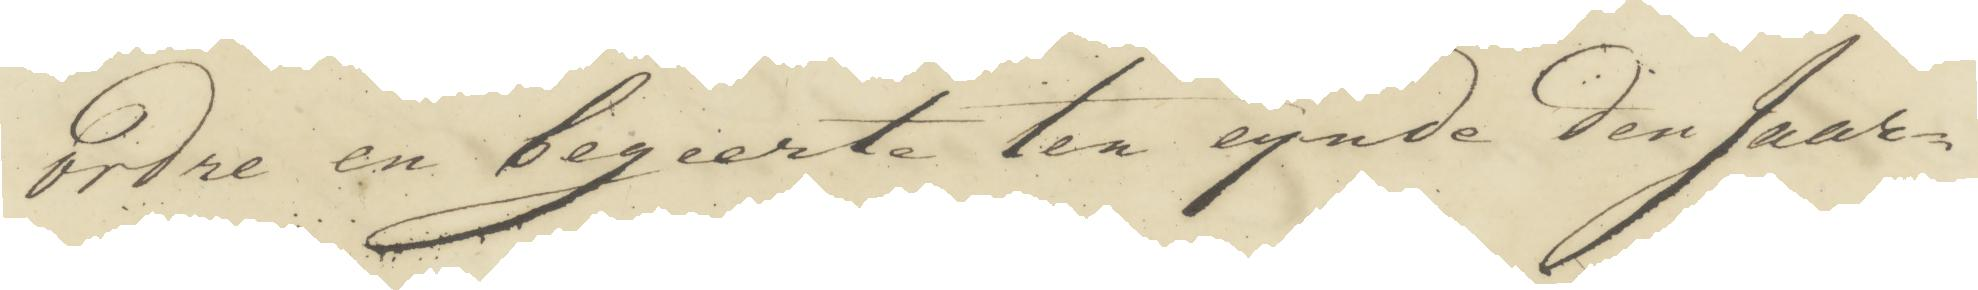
ordre en begeerte ten eijnde den Jaar
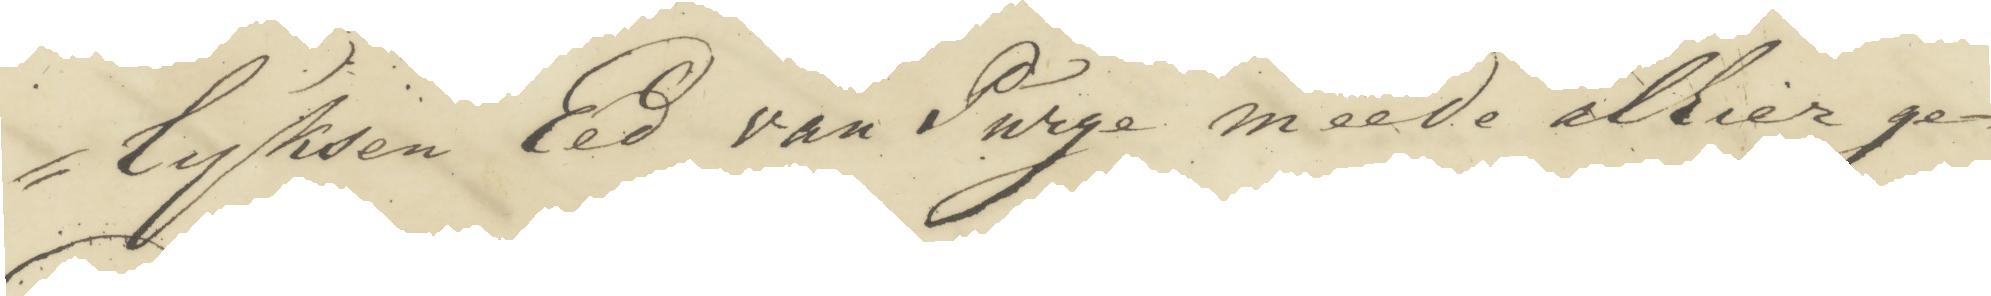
„lijksen Eed van Purge meede alhier ge=
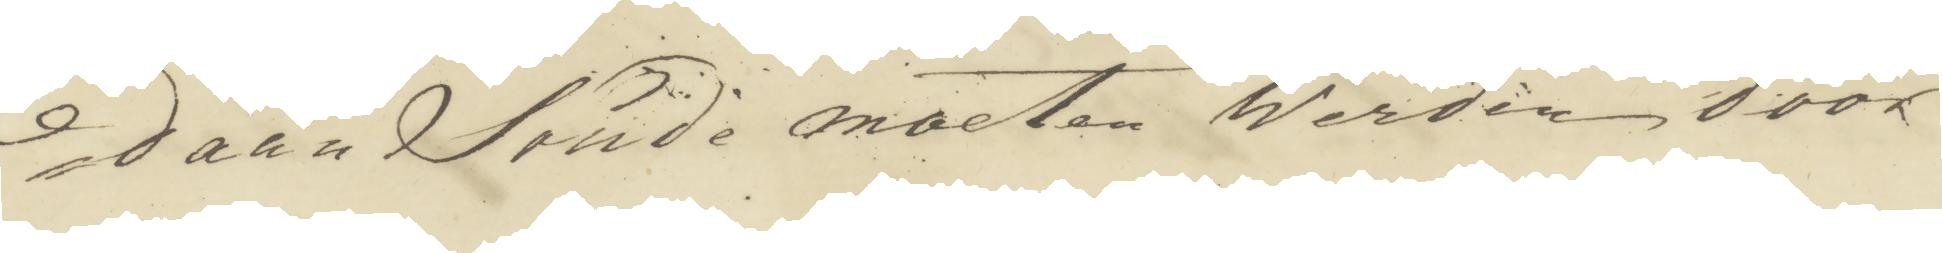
„daan Soude moeten werden, door
